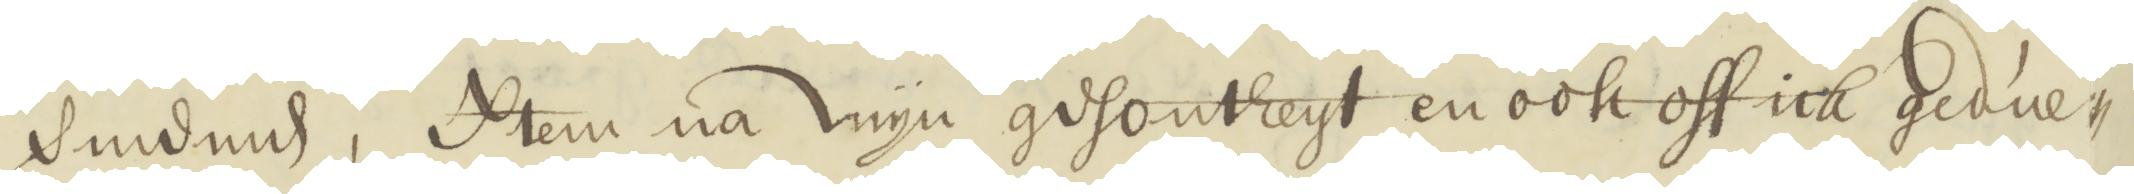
vernemen, Item na mijn gesontheyt en ook off ick gedue„
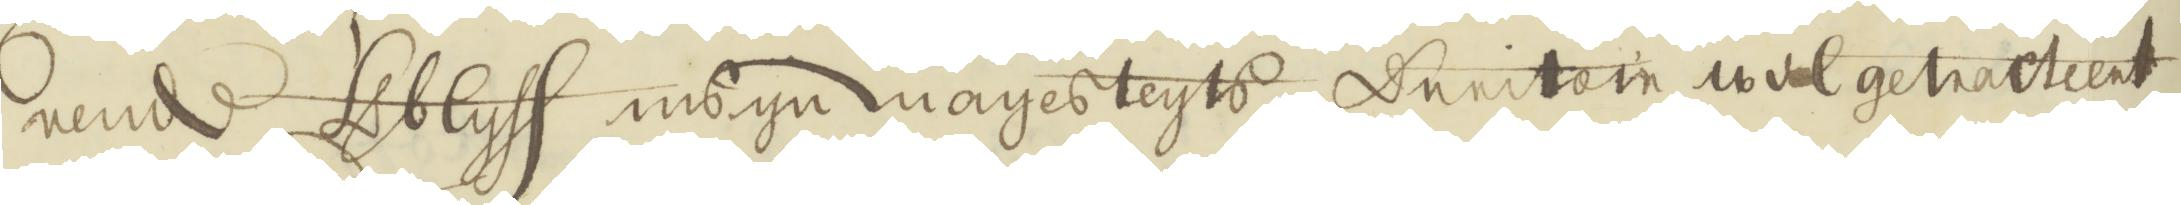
rende 't verblyff insyn mayesteyts territoir wel getracteert
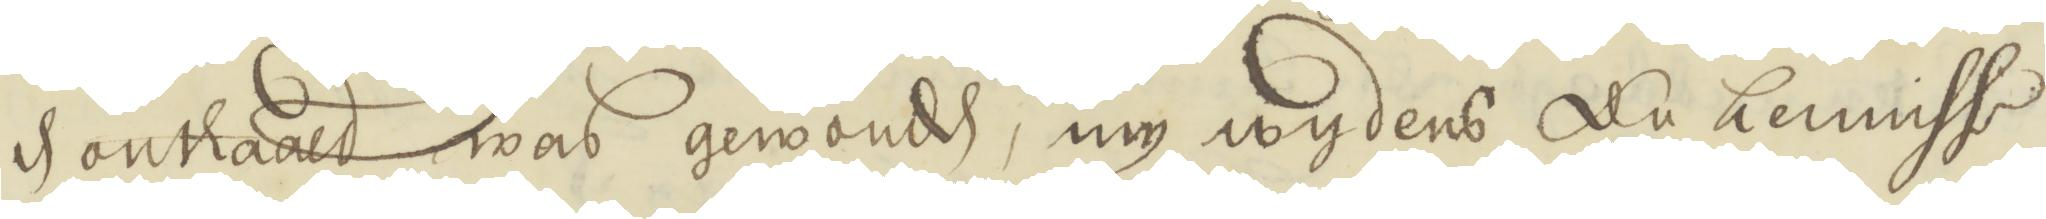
en onthaald was geworden, my wyders ter kennisse
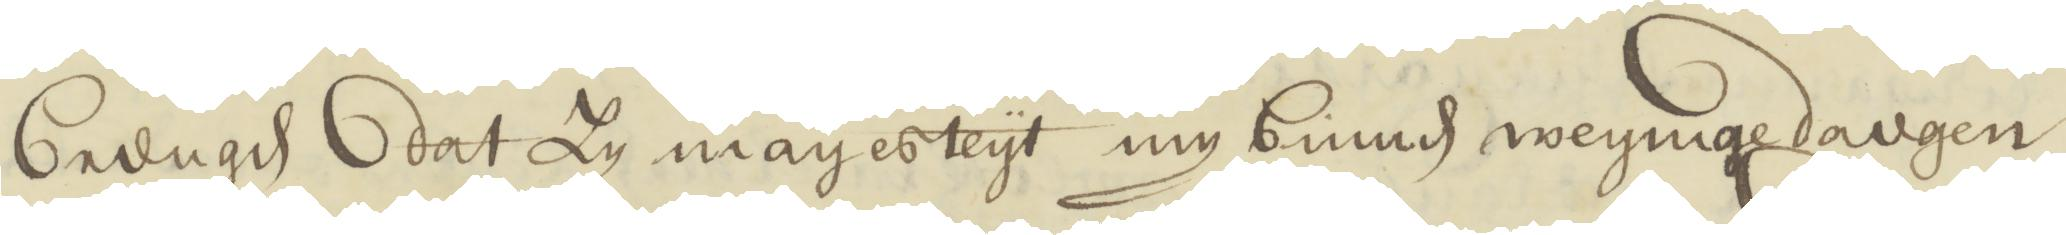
brengen dat Zy maijesteijt my binnen weynige daegen
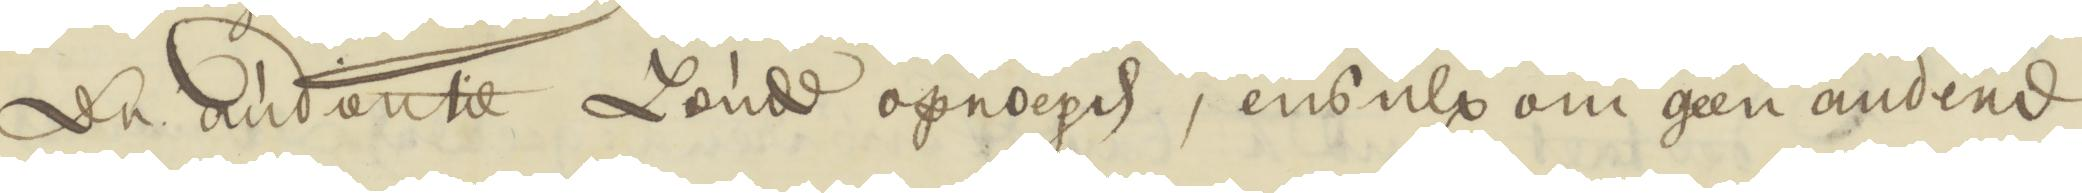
ter audientie Zoude oproepen, en sulx om geen andere
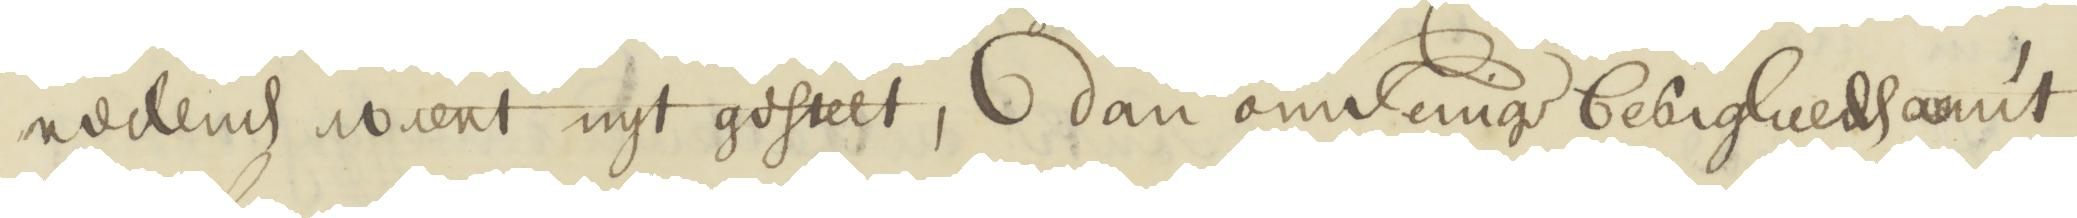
redenen wiert uyt gestelt, dan om Eenige besigheeden van’t
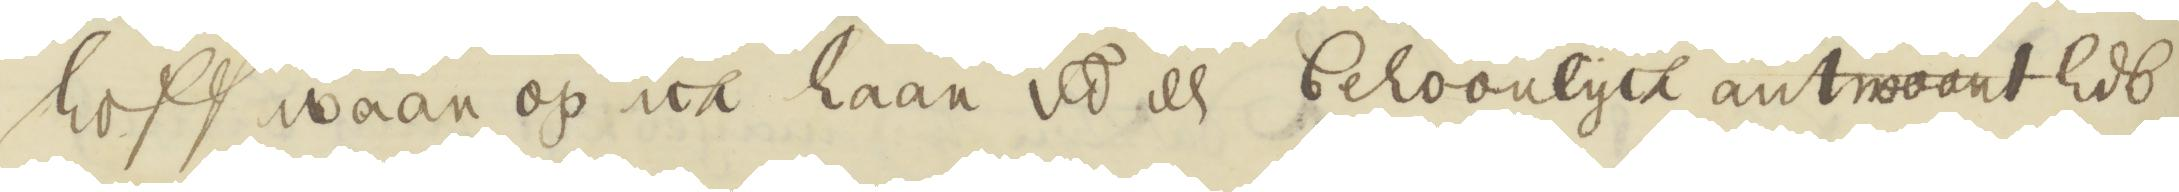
hoff waar op ick haar Ed een behoorlijck antwoort heb
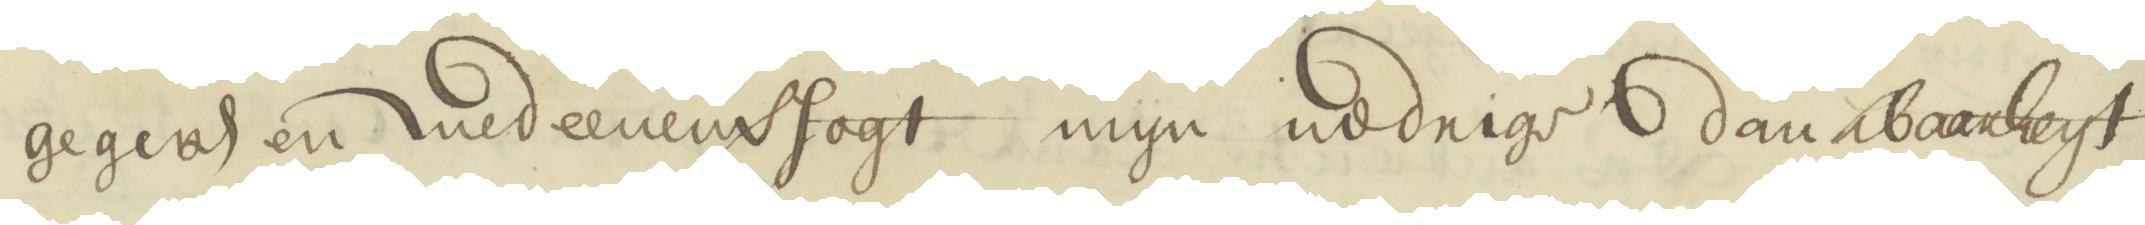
gegeven en med eenen versogt mijn nedrige dankbaarheyt
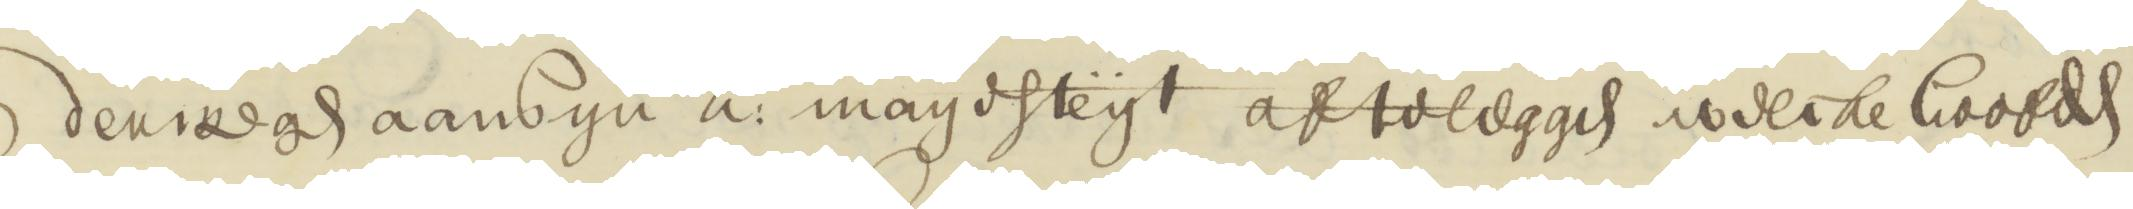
derwegen aansyn k: maijesteijt afteleggen welcke hoofden
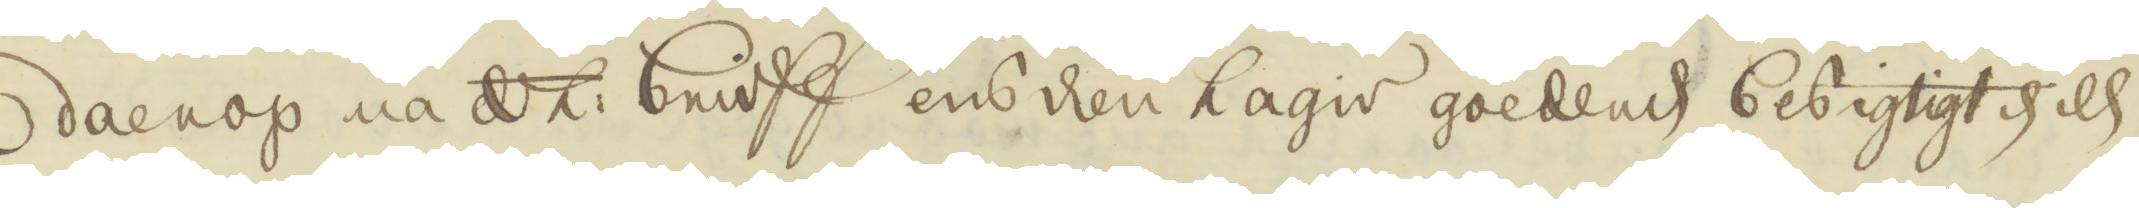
daerop na de k: brieff en schen kagie goederen besigtigten een
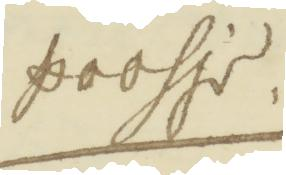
poosje
